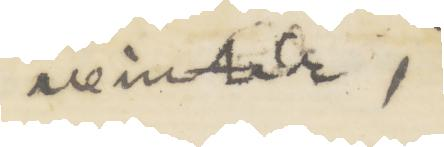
winter,
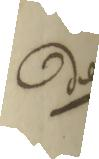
d
